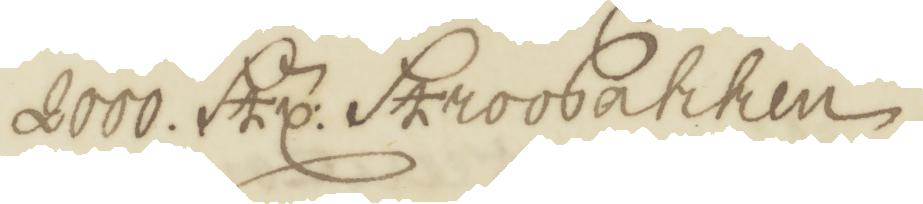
2000. Stx: Stroosakken
